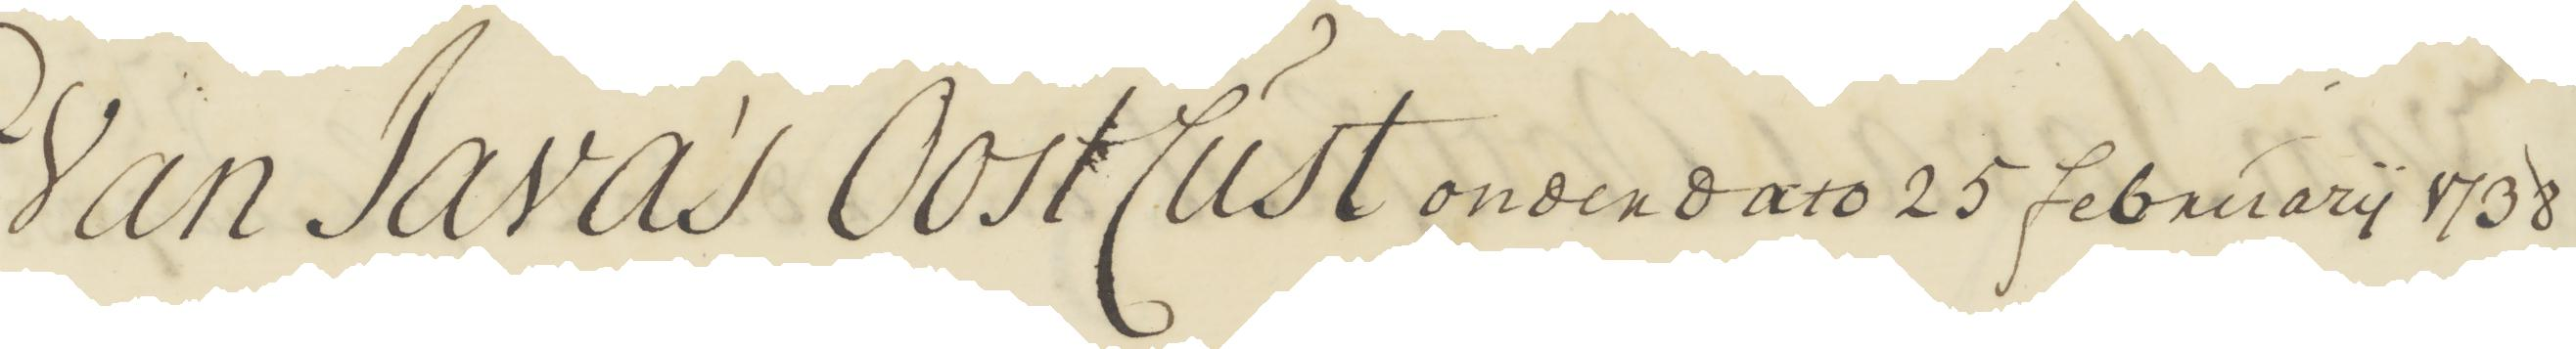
Van Iava's Oost Cust onder dato 25 februarij 1738
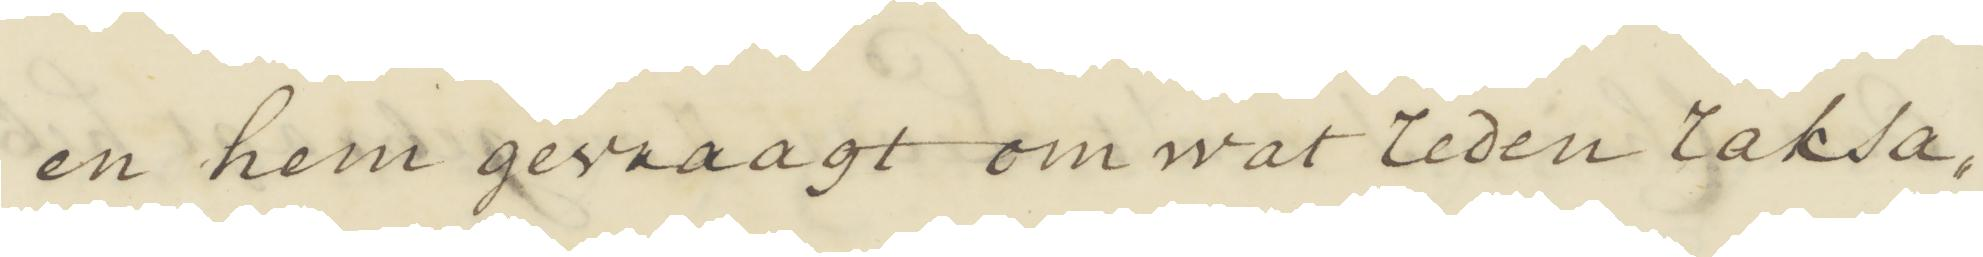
en hem gevraagt om wat reden raksa„
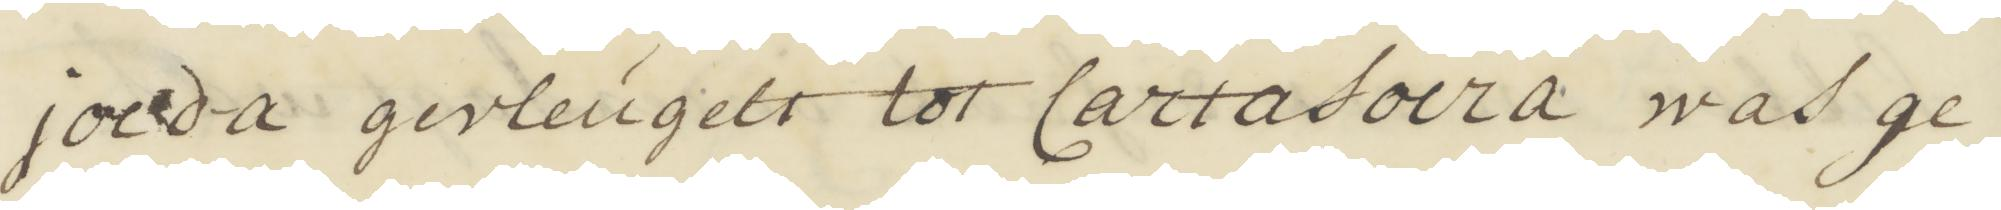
joeda gevleugelt tot Cartasoera was ge
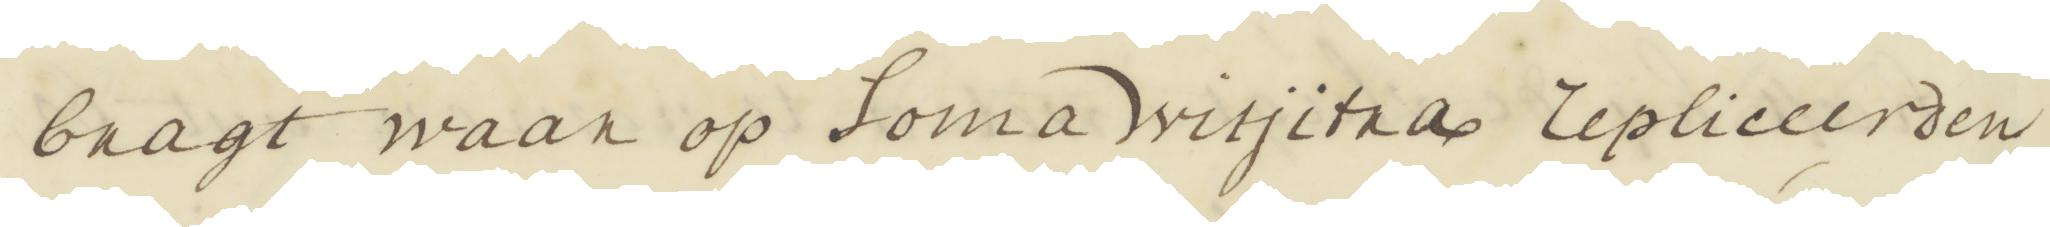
bragt waar op soma witjitra repliceerden
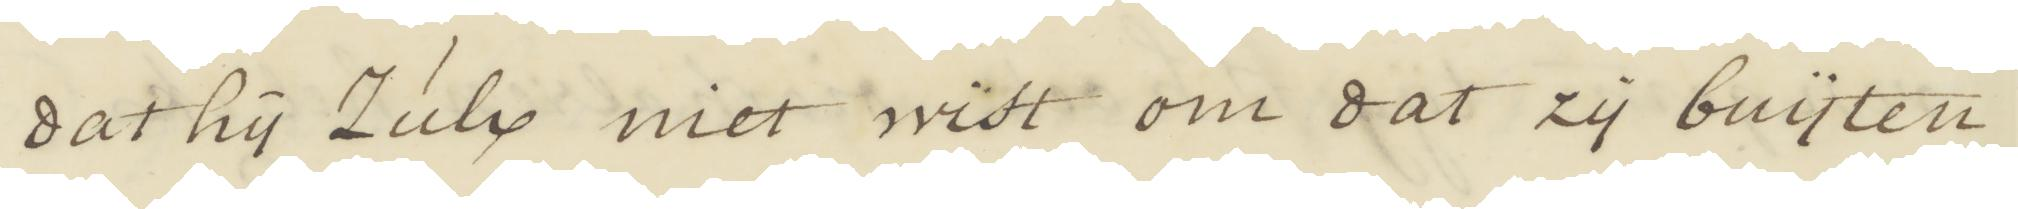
dat hij zulx niet wist om dat zij buijten
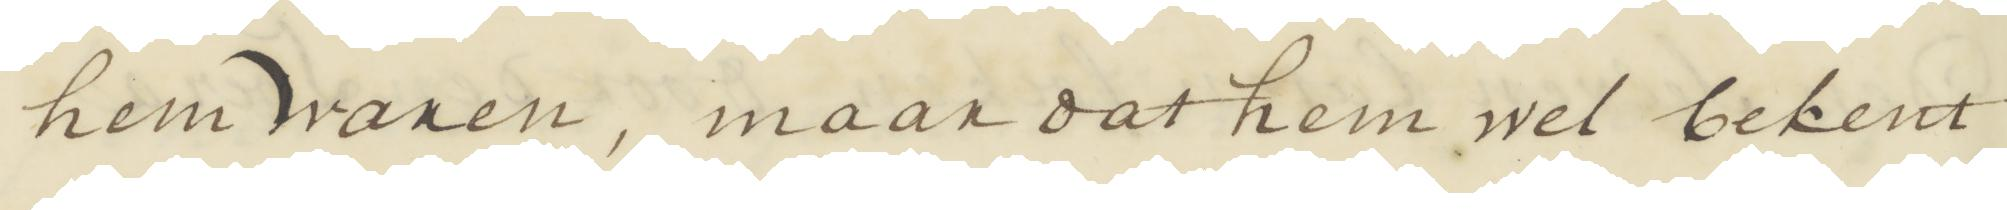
hem waren, maar dat hem wel bekent
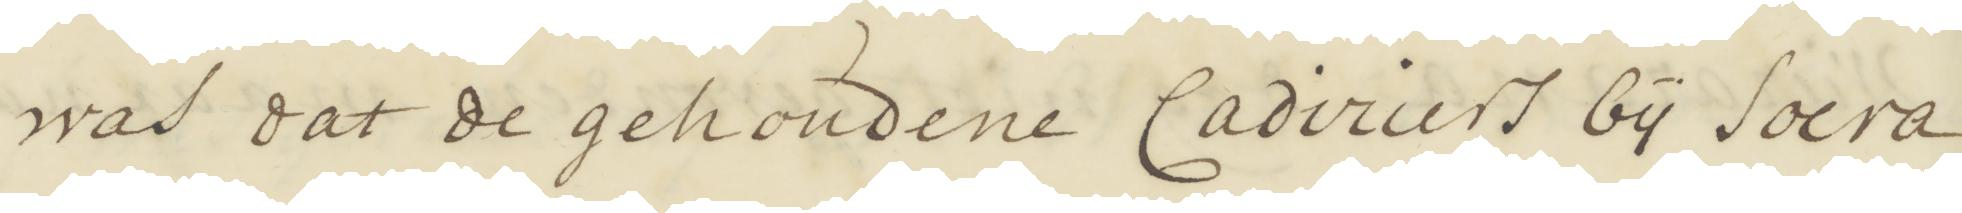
was dat de gehoudene Cadiriers bij soera
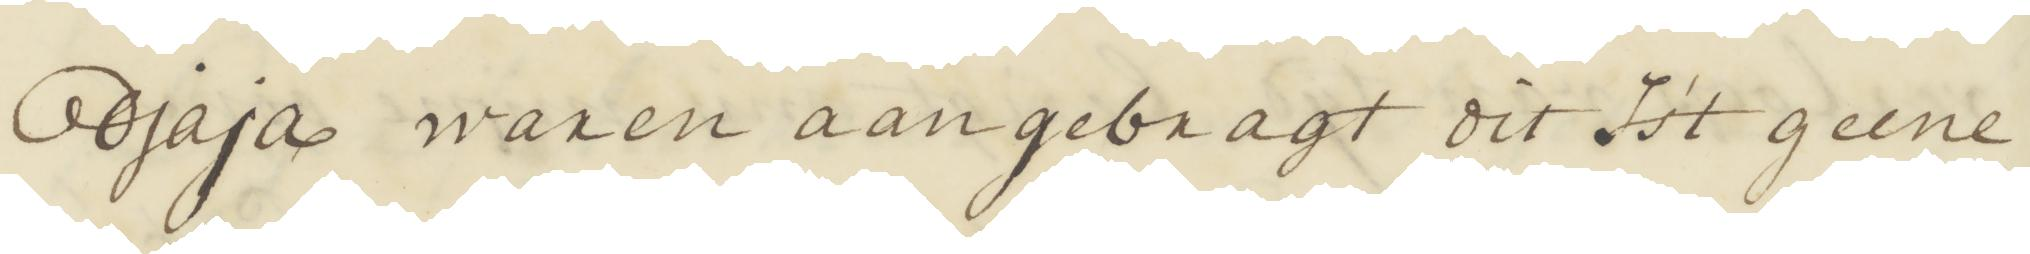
djaja waren aangebragt dit Is't geene
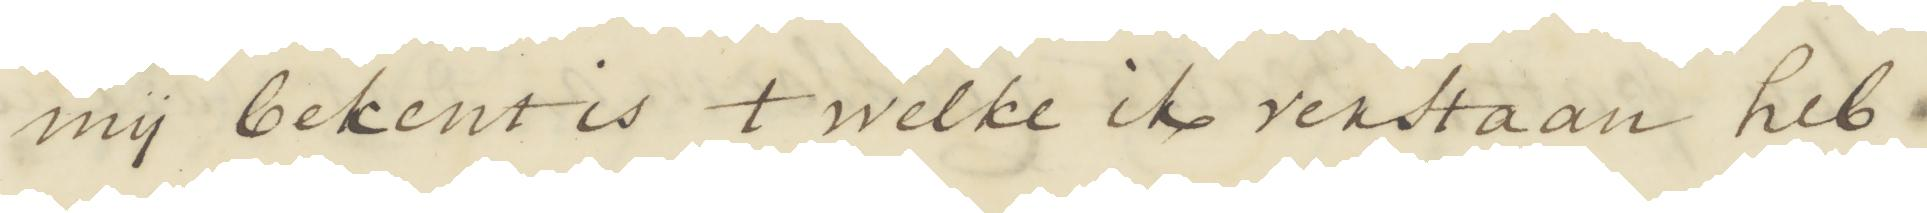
mij bekent is t welke ik verstaan heb
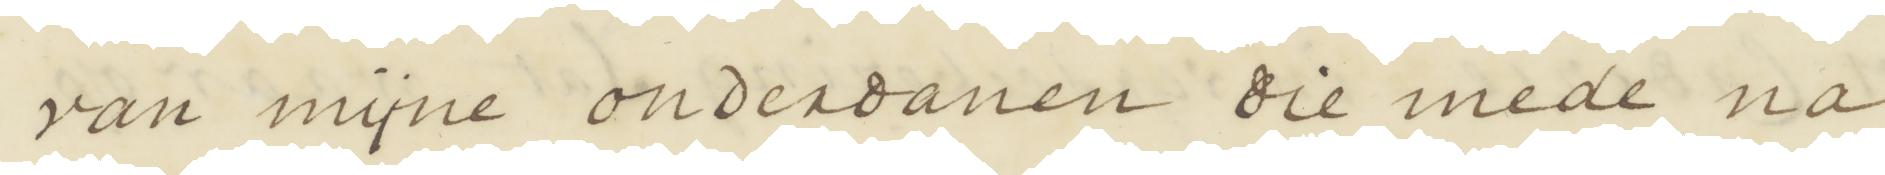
van mijne onderdanen die mede na
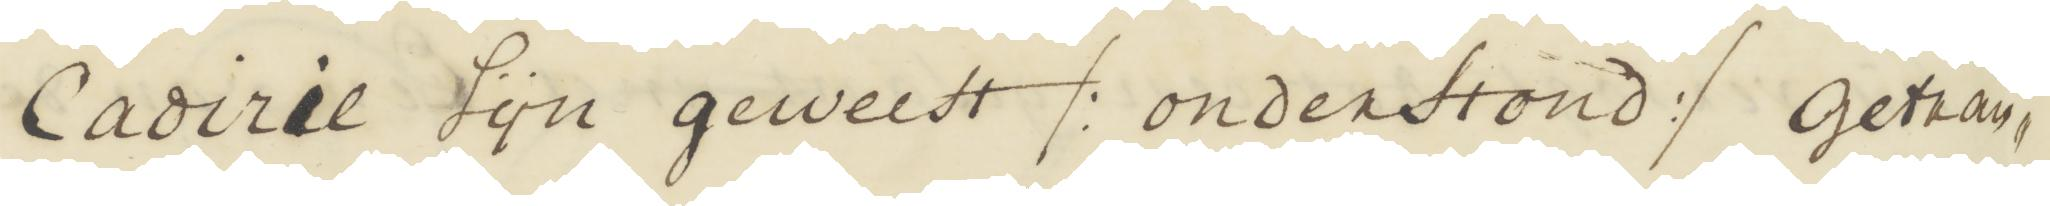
Cadirie sijn geweest /: onderstond:/ getran„
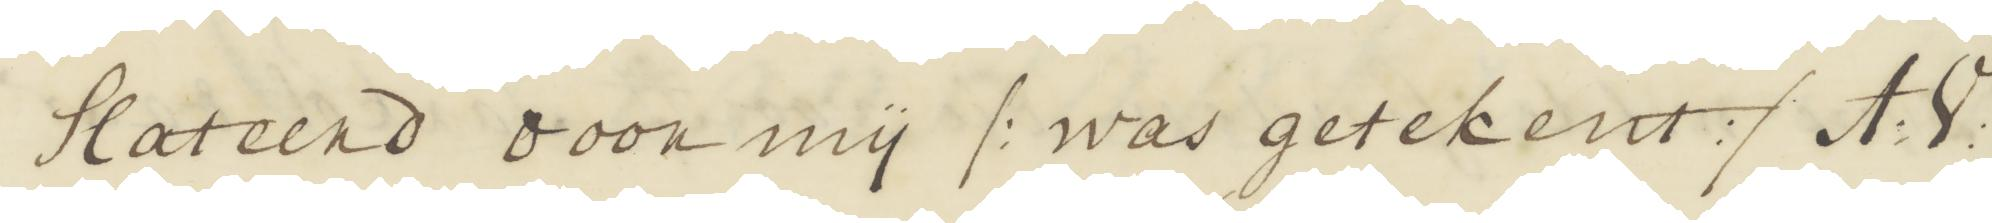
slateerd door mij /:was getekent:/ A: V:n
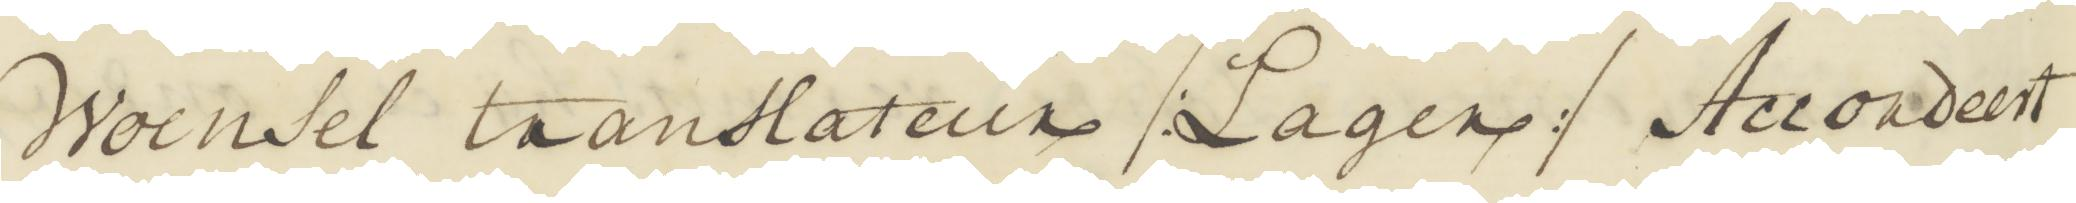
Woensel translateur /:Lager:/ Accordeert
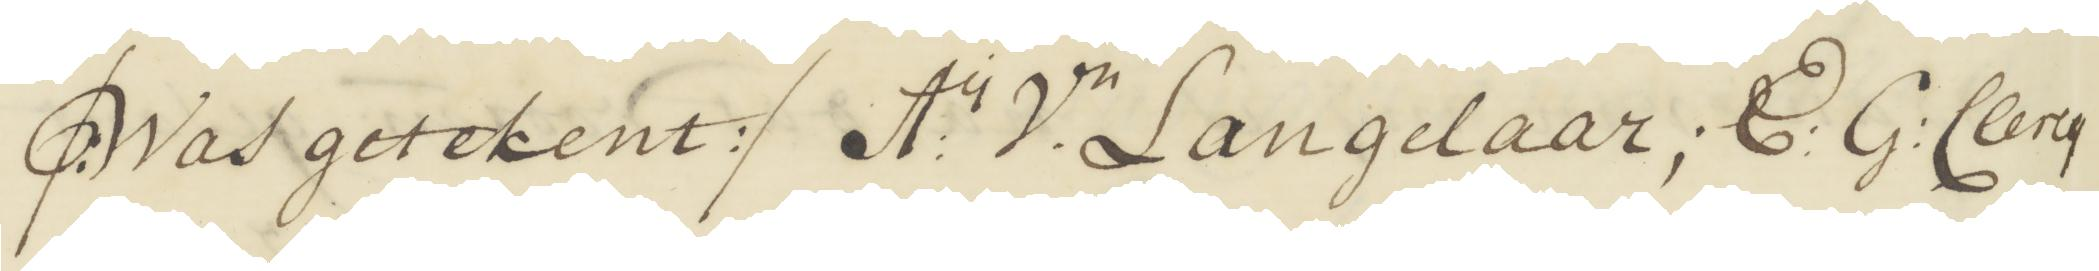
/:Was getekent:/ A:y V:n Langelaar; E: G: Clercq
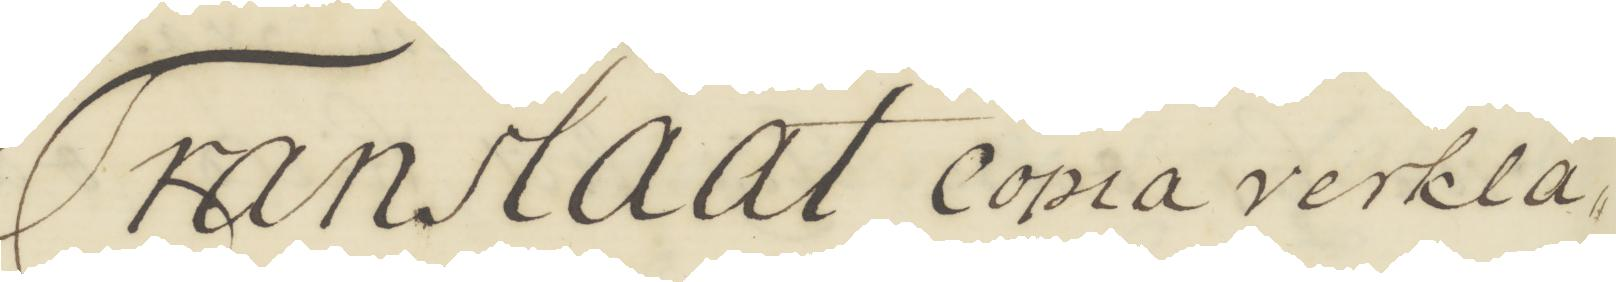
Translaat copia verkla„
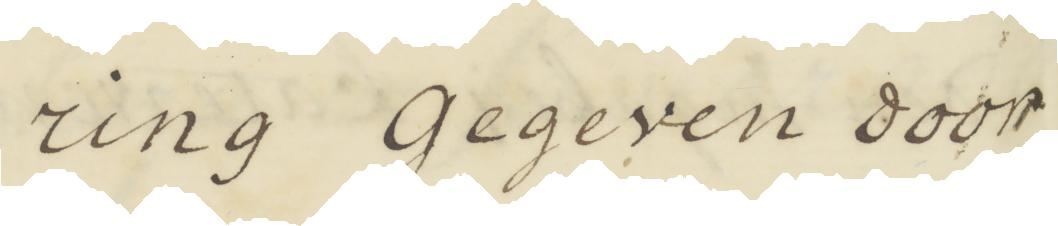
ring gegeven door
